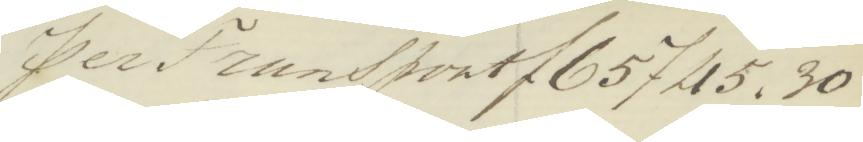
Per Transport ƒ 65 ƒ 45, 30
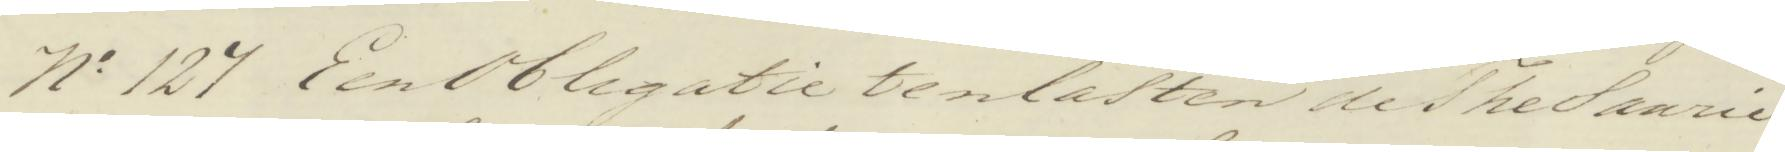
N.o 127 Een obligatie ten lasten de Thesaurie
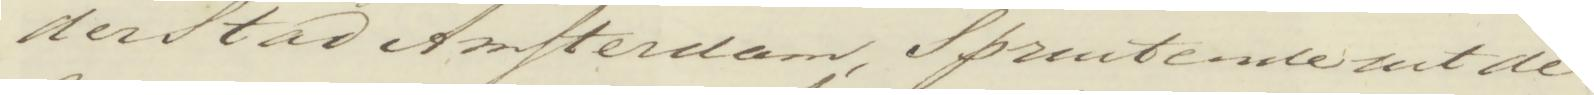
der stad Amsterdam, spruitende uit de
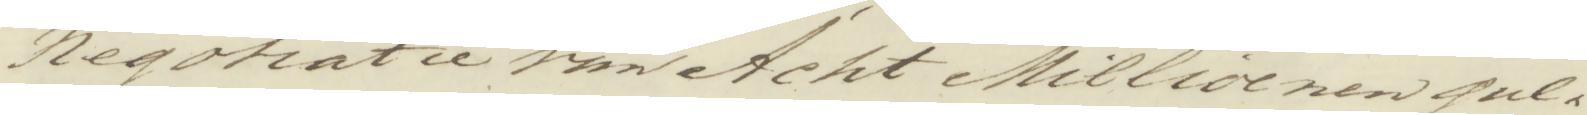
Negotiatie van Acht Millioenen gul„
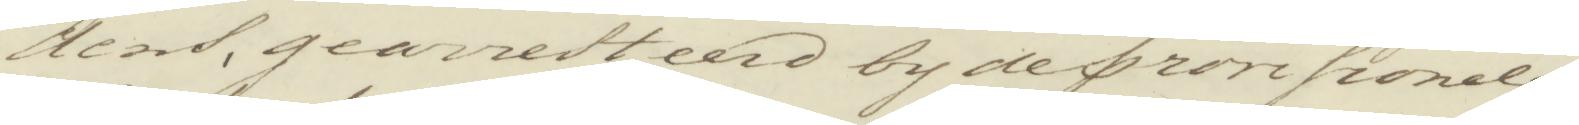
dens, gearresteerd by de provisionele
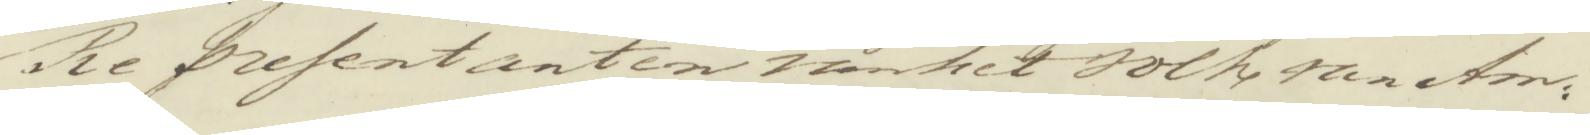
Representanten van het volk van Am„
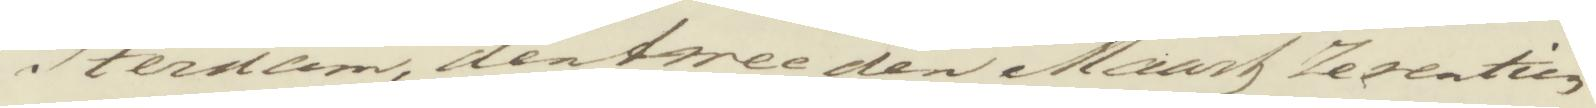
sterdam, den tweeden Maart Zeventien
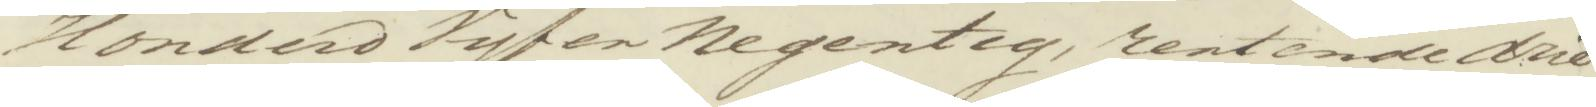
Honderd Vyf en Negentig, rentende drie
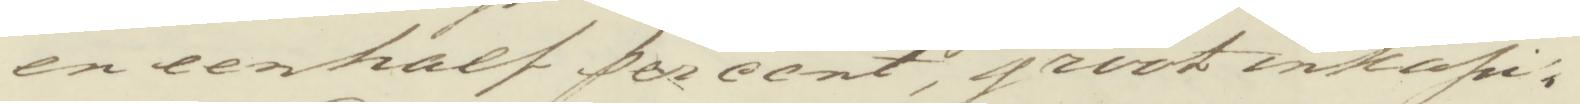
en een half percent, groot in kapi„
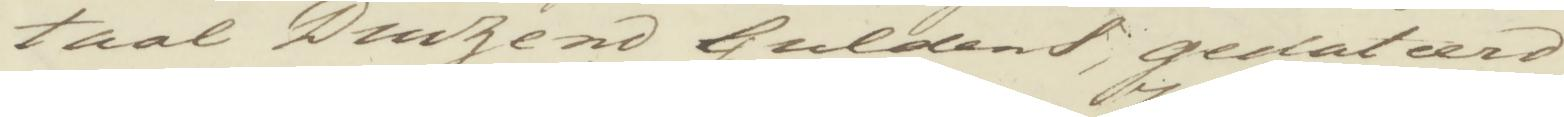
taal Duizend Guldens, gedateerd
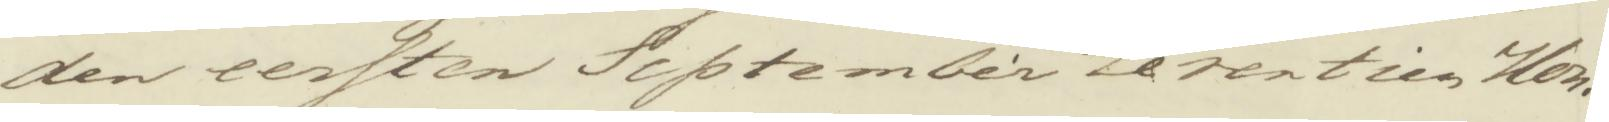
den eersten September zeventien Hon„
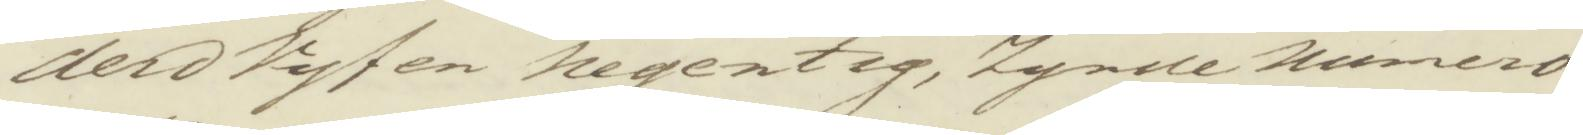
derd Vyf en Negentig, zynde numero
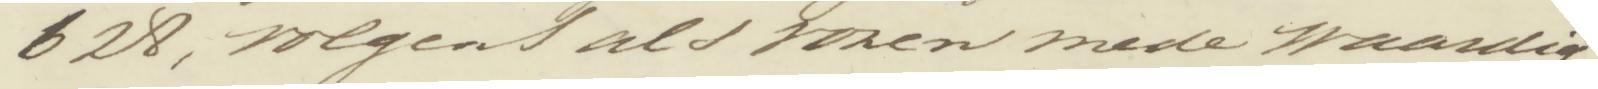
628, volgens als voren mede waardig
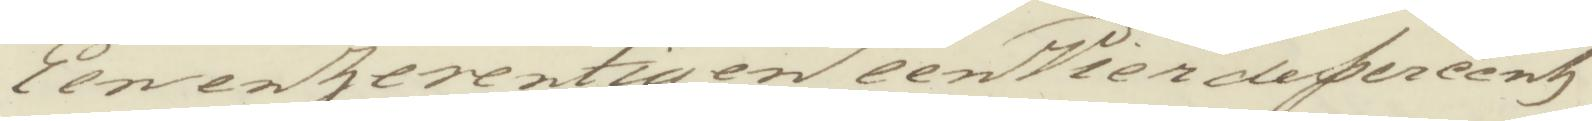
Een en Zeventig en een Vierde percent
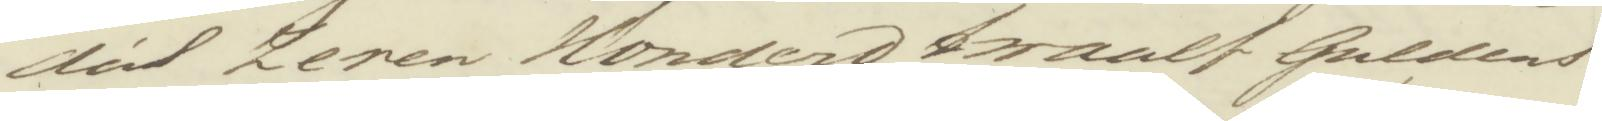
dus Zeven Honderd twaalf Guldens
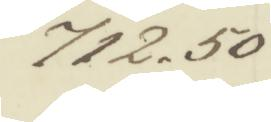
712.50
